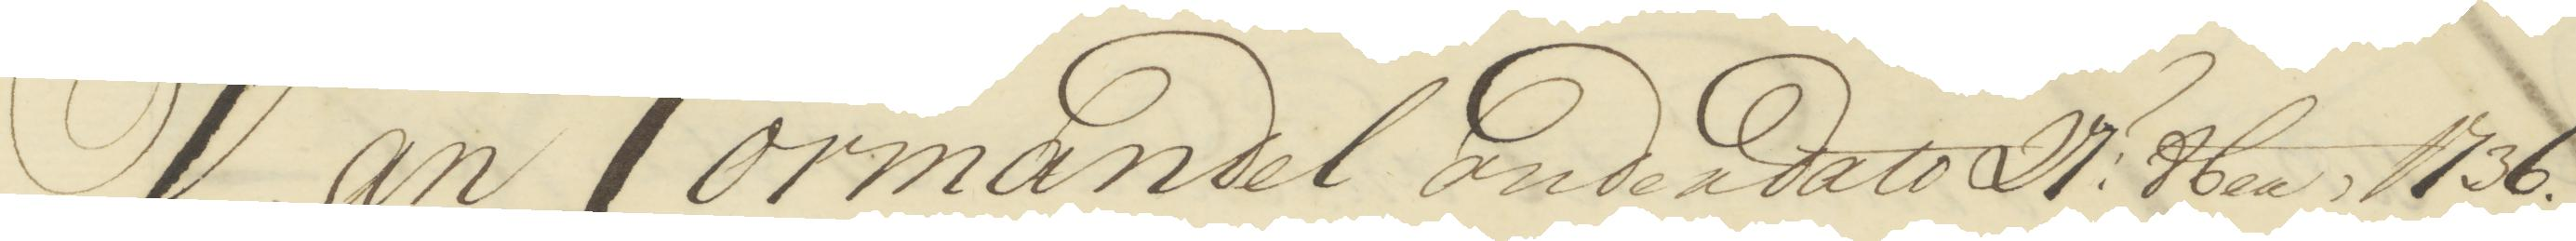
Van Cormandel onder dato 27:' 8ber: 1736.
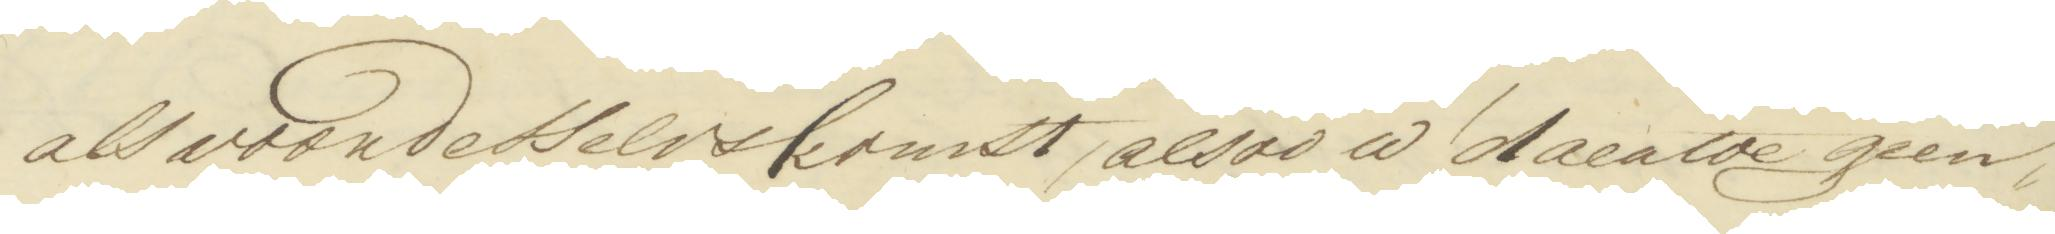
als voor desselvs komst, alsoo w' daertoe geen„
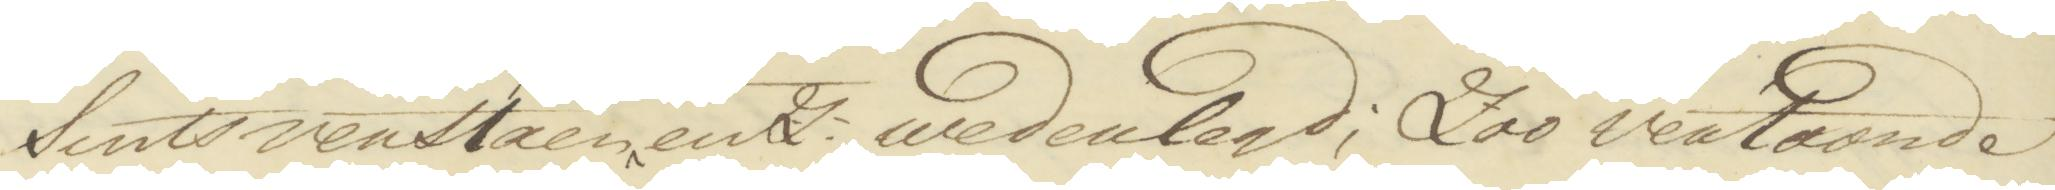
sints verstaen ^ enz: wederleyd; zoo vertoonde
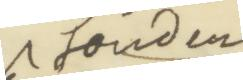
^souden
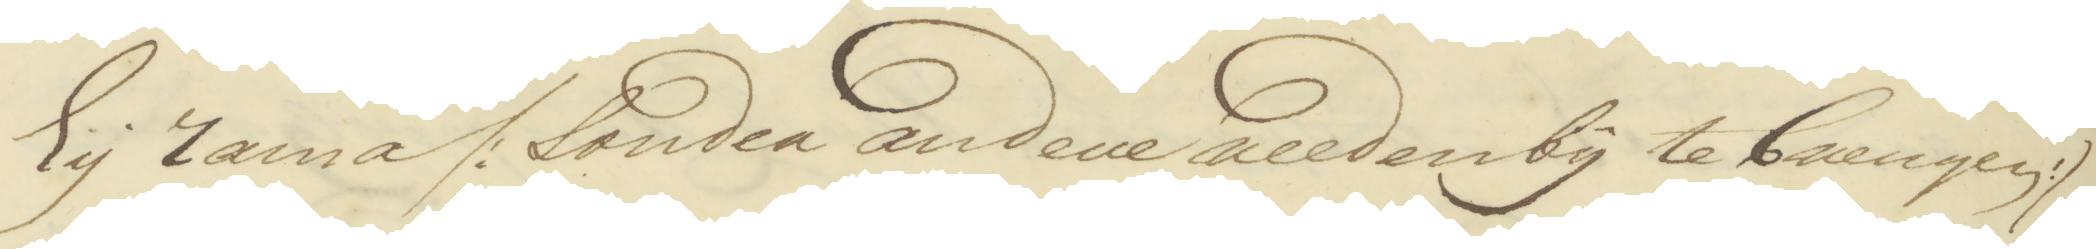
hij rama /: sonder andere reeden bij te brengen:/
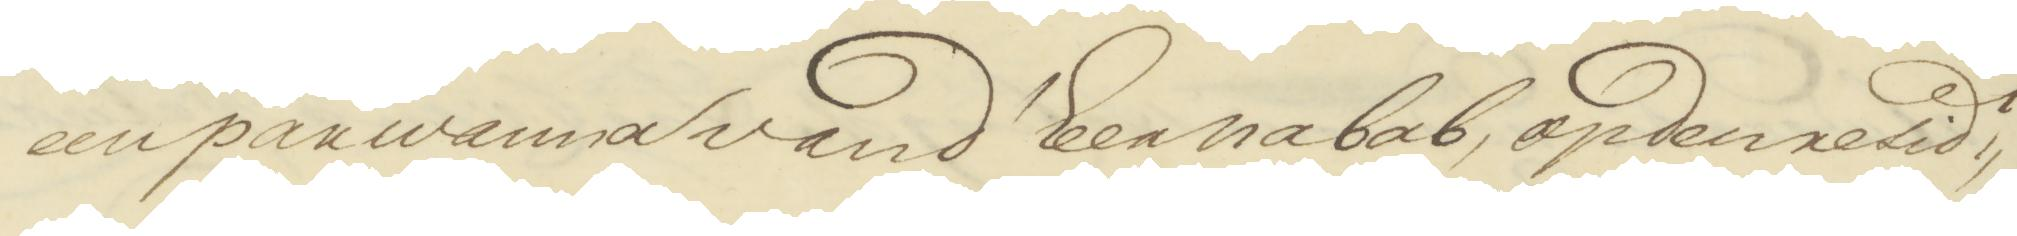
een parwanna van d' heer nabab, op den resid„t
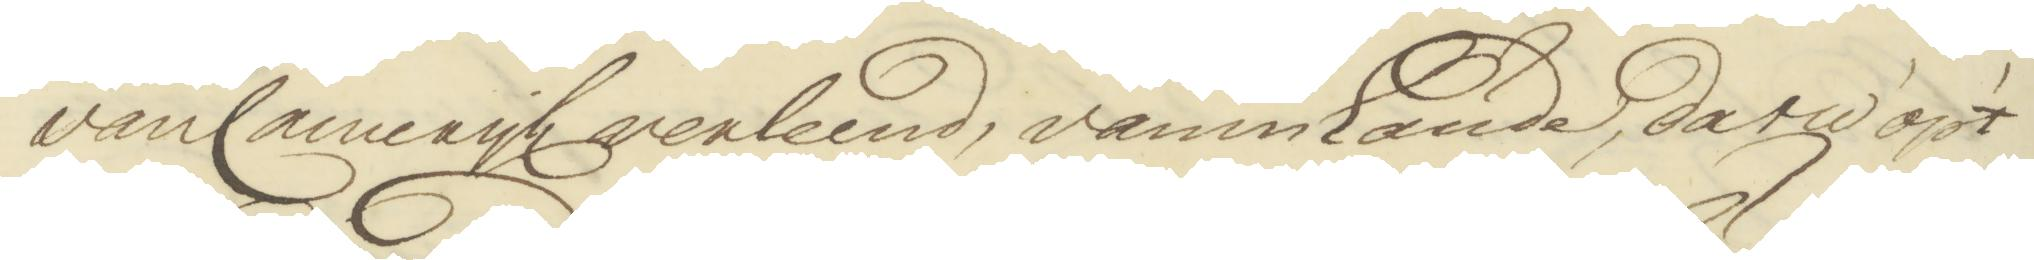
van Camerijk verleend, van inhoude, dat w' op't
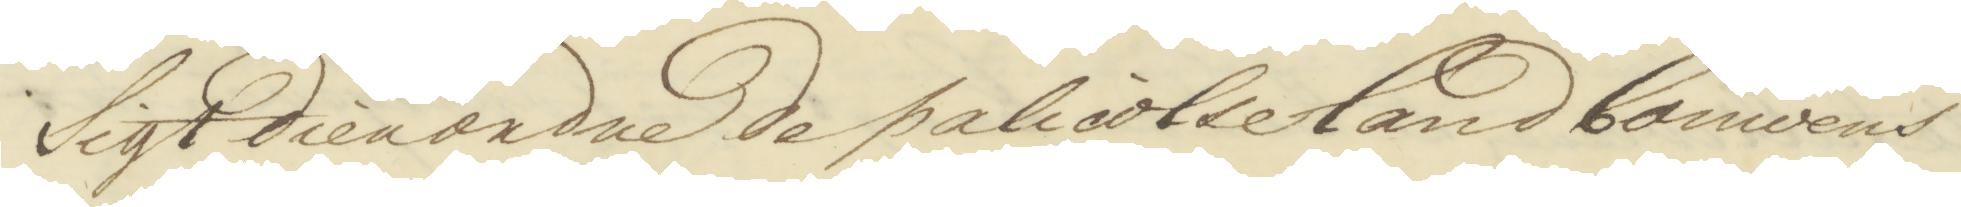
sigt dier ordre de palicolse land bouwers
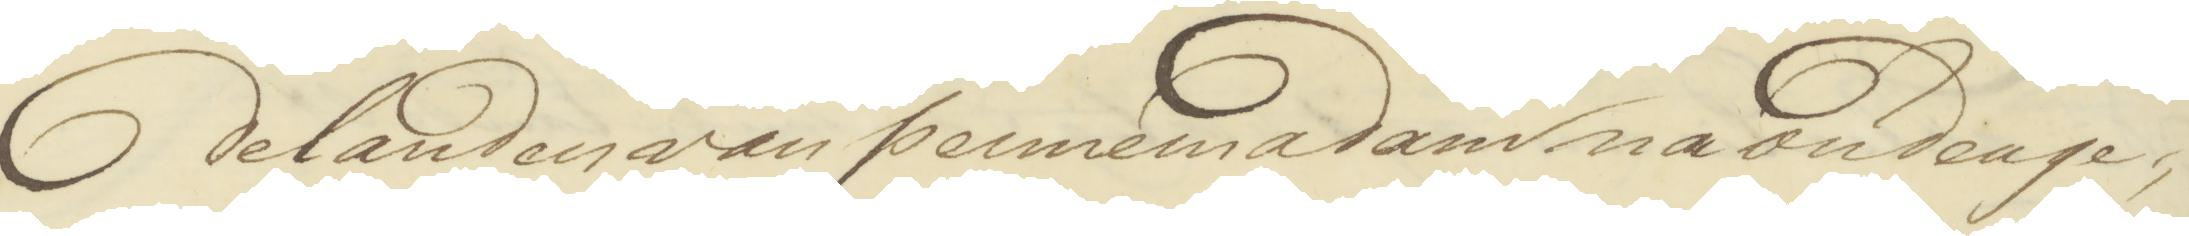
de landen van pennemadam na ouderge„
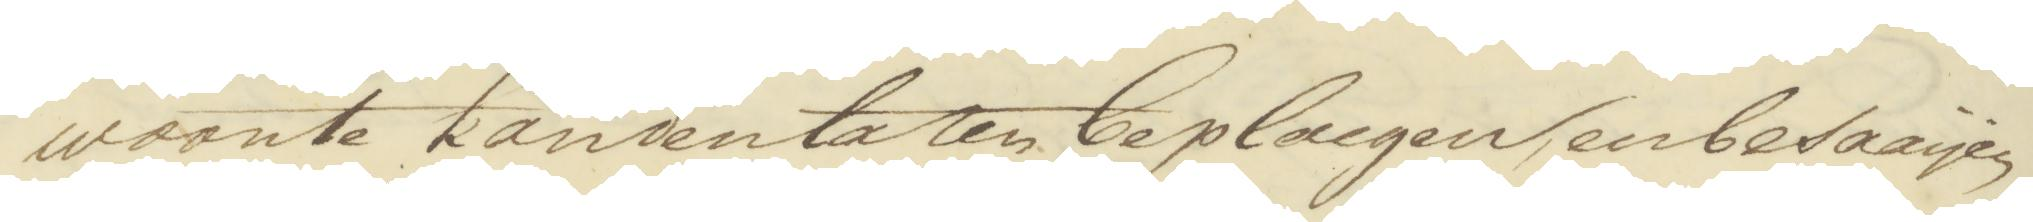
woonte konden laten beploegen, en besaaijen
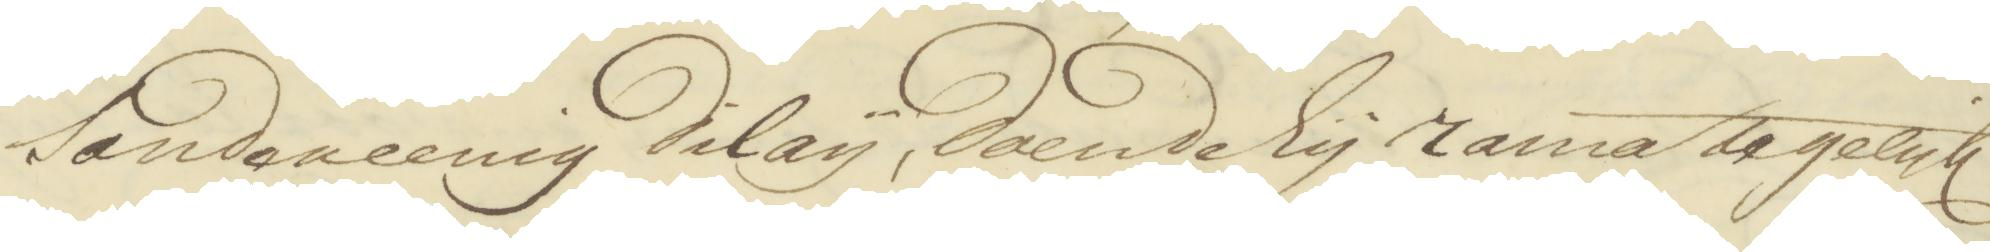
sonder eenig dilaij, doende hij rama te gelijk
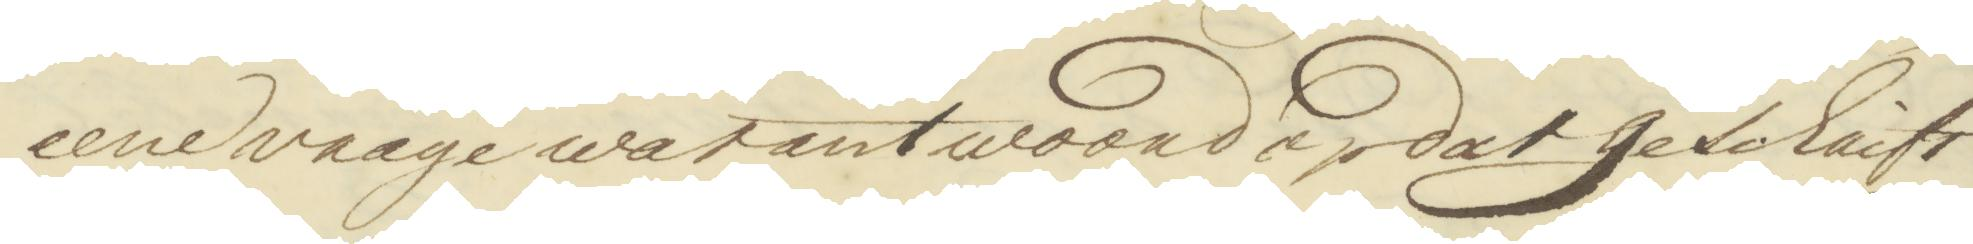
eene vrage wat antwoord op dat geschrift
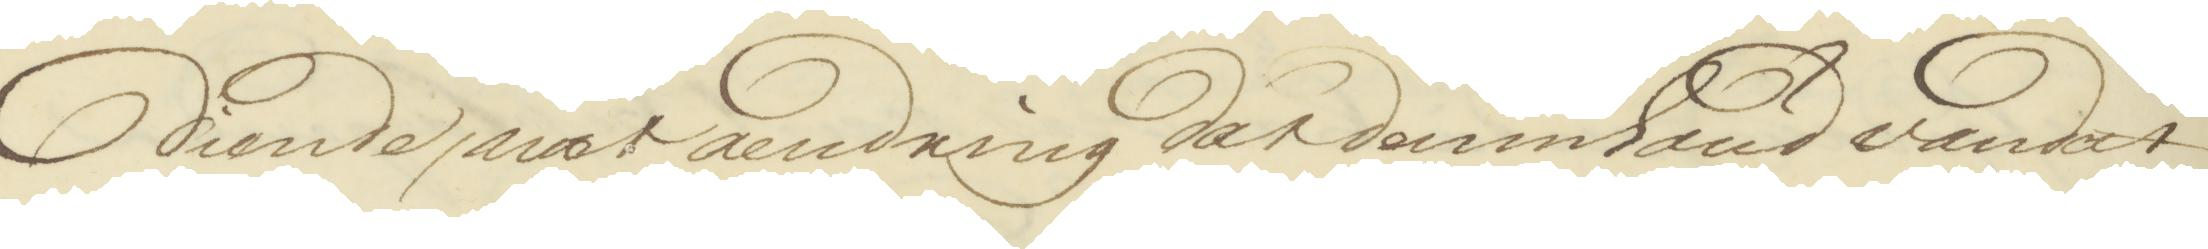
diende, met aendring dat den inhoud van dat
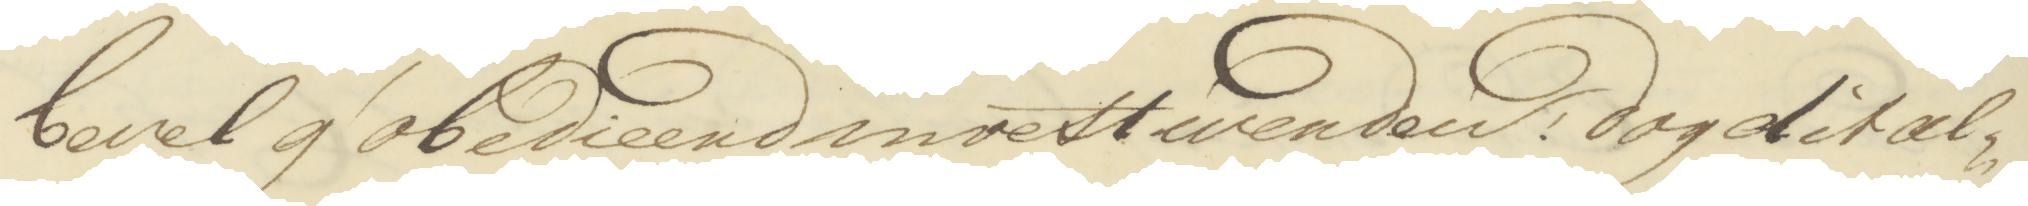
bevel g'obedieerd moest werden, dog dit al„
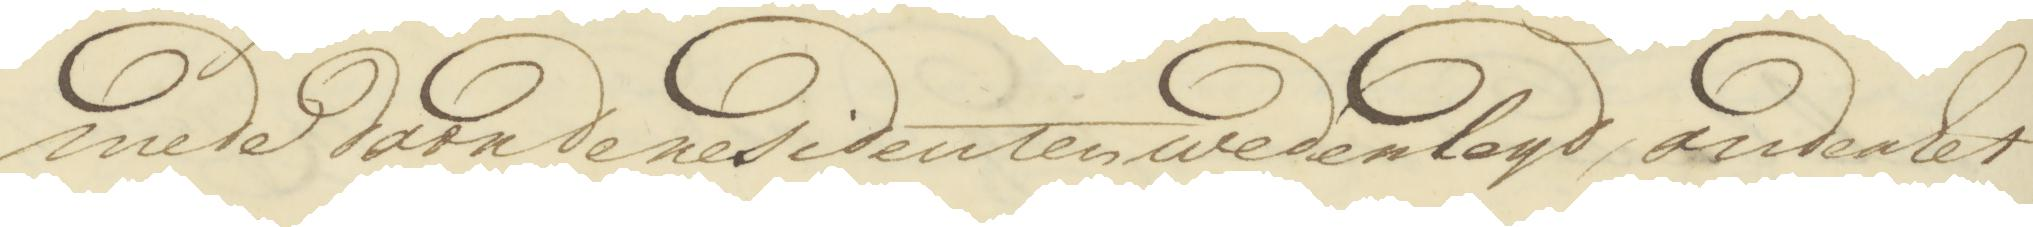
mede door de residenten wederleyd, onder het
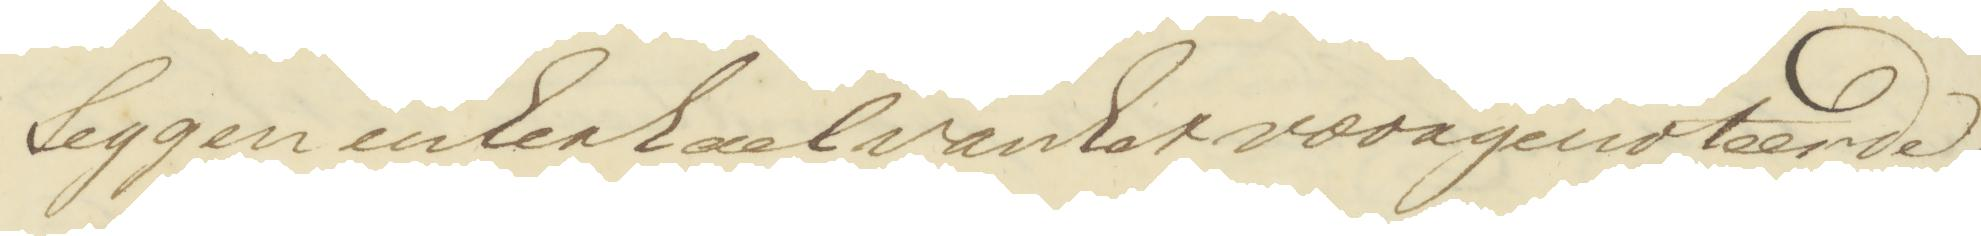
seggen en herhael van het voorgenoteerde,
